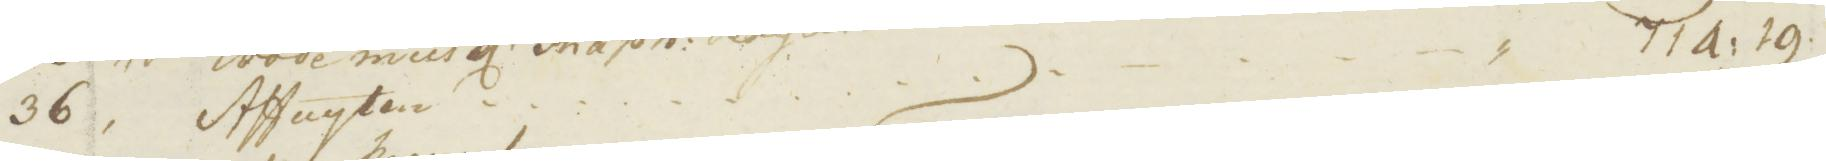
36 „ Affuyten . . . . . . . . . . - - - - - „ 714: 19.
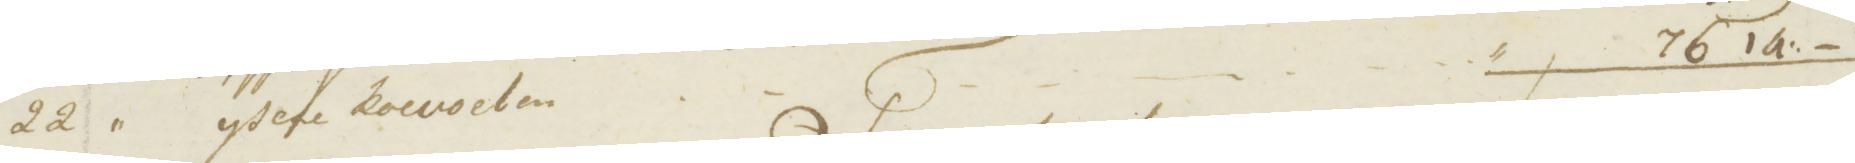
22 „ ijsere koevoeten - - - - - - - - - „ 76 14: —
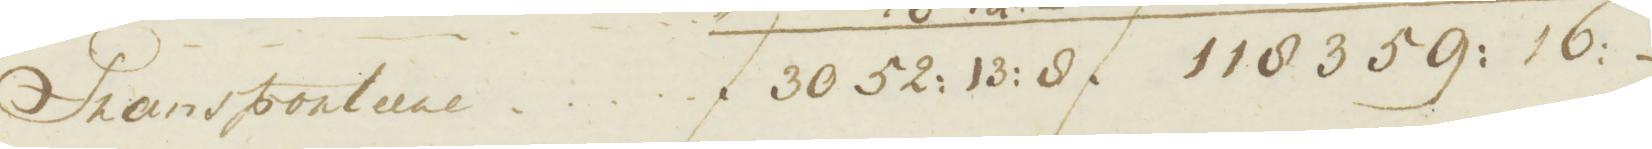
Transporteere . . . . . ƒ 3052: 13: 8 ƒ 118359: 16: -
